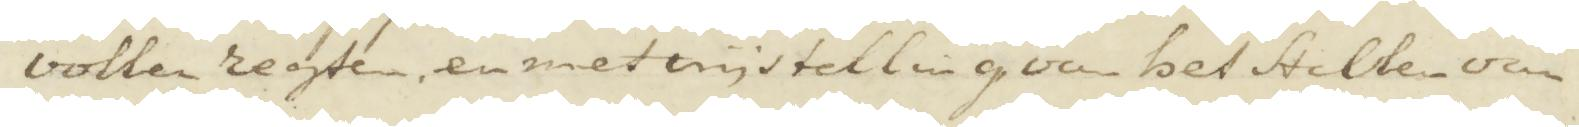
vollen regten, en met vrijstelling van het stellen van
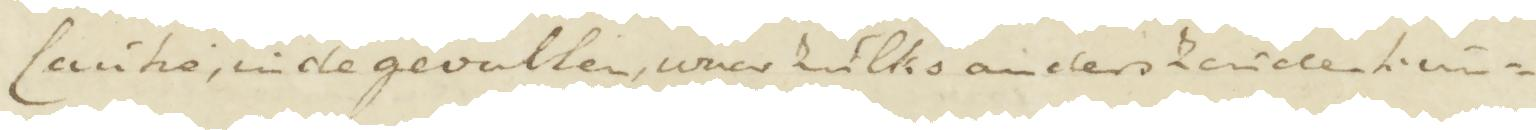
Cautie, in de gevallen, waar zulks anders zoude kun=
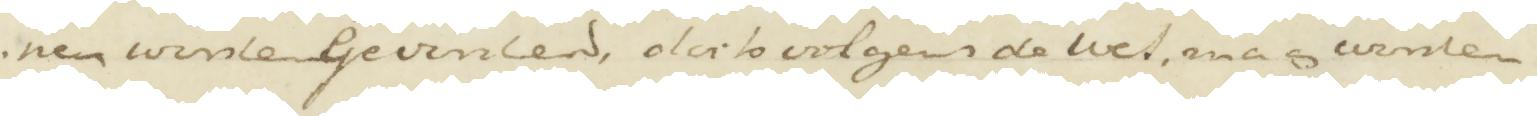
„nen worden Gevorderd, dit volgens de wet, mag worden
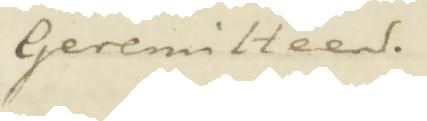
Geremitteerd.
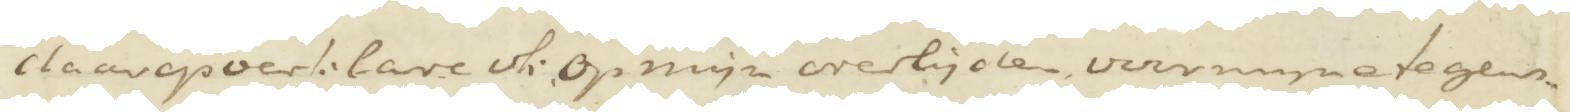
daarop verklare ik op mijn overlijden, voor mijne tegens,
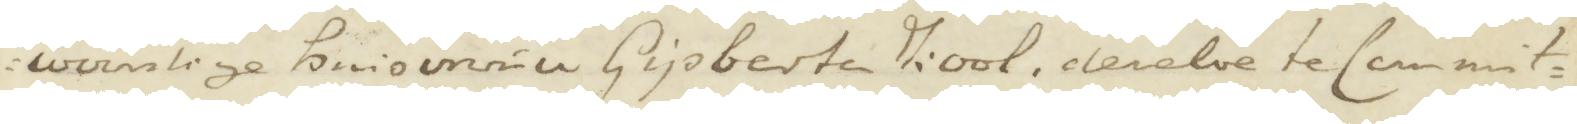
=woordige huis vrouw Gijsberta Kool, dezelve te Commit=
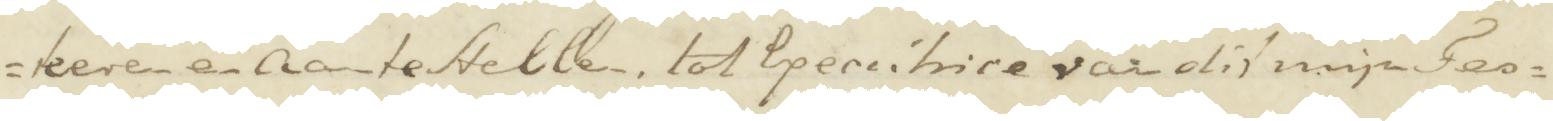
=teeren en aan te stellen, tot Executrice van dit mijn Tes=
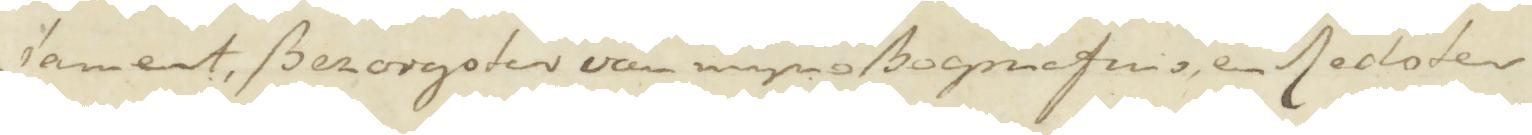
=tament, Bezorgster van myne Begrafenis, en Redster
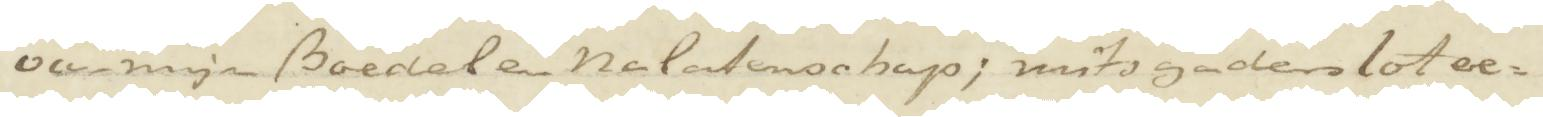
van mijn Boedel en Nalatenschap; mitsgaders tot ee=
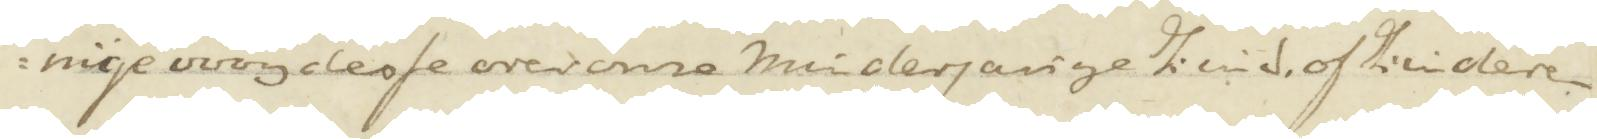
=nige voogdesse over onze minderjarige kind, of kinderen
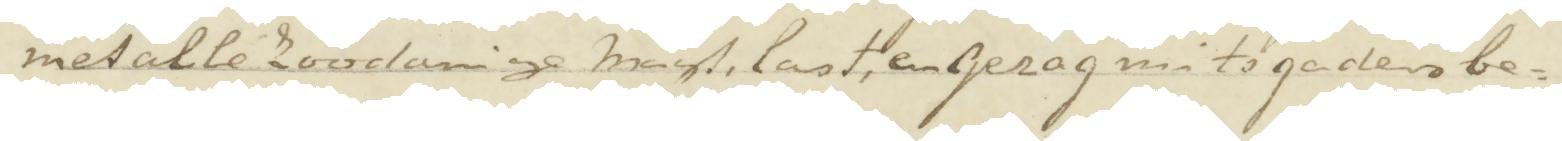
met alle zoodanige magt, last, en gezag mitsgaders be=
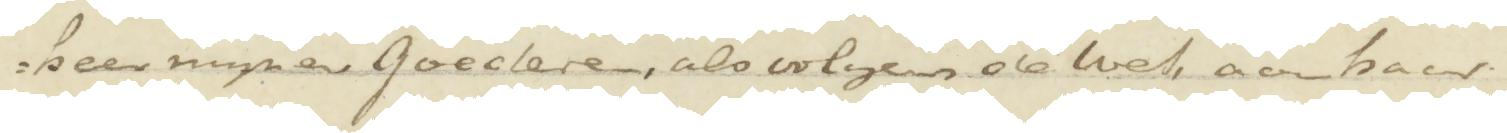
=heer mynen Goederen, als volgens de wet aan haar
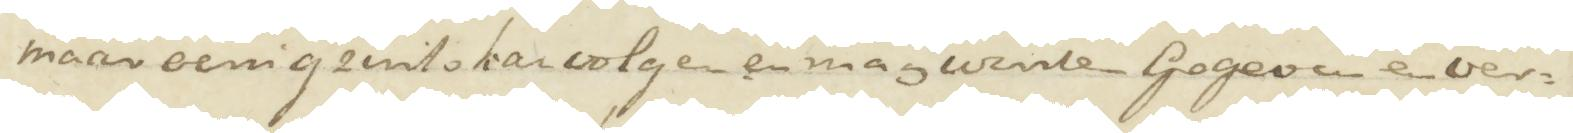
maar eenigsints kan volgen en mag worden Gegeven en ver=
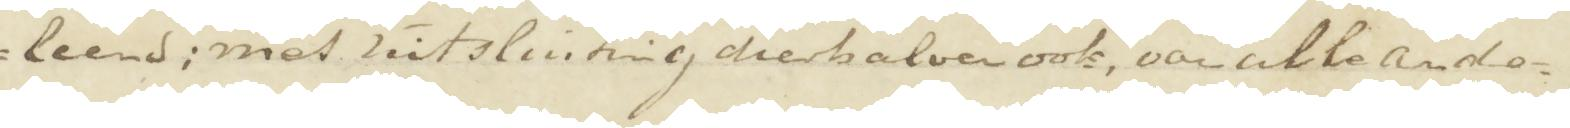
=leend: met uitsluiting dierhalven ook, van alle ande=
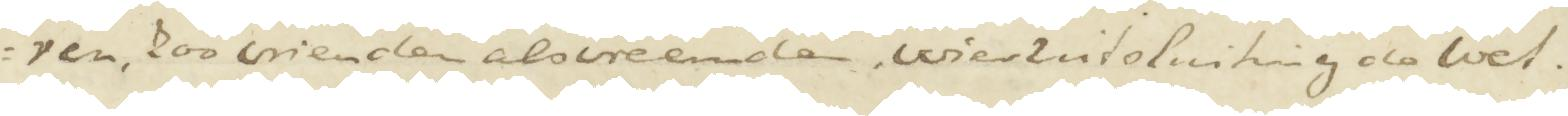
=ren, zoo vrienden als vreemden wiens uitsluiting de wet.
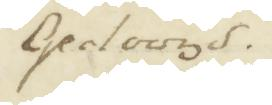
Gedoogd.
